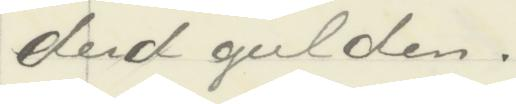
derd gulden.
